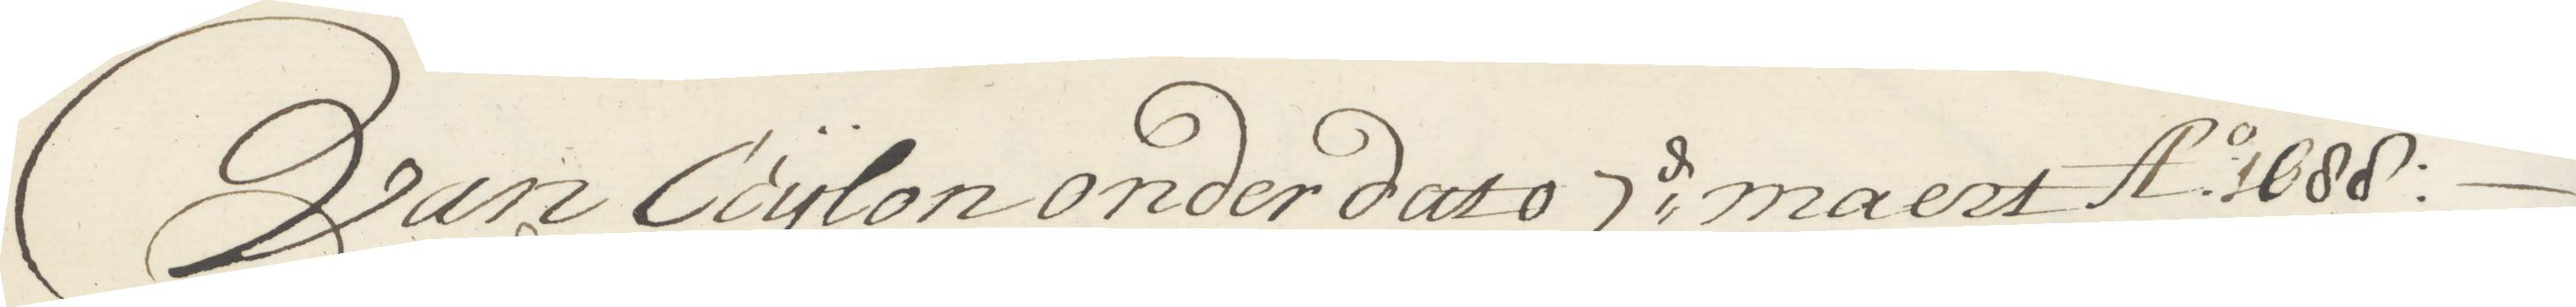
Van Ceijlon onder dato 7„en maert A:o 1688: —
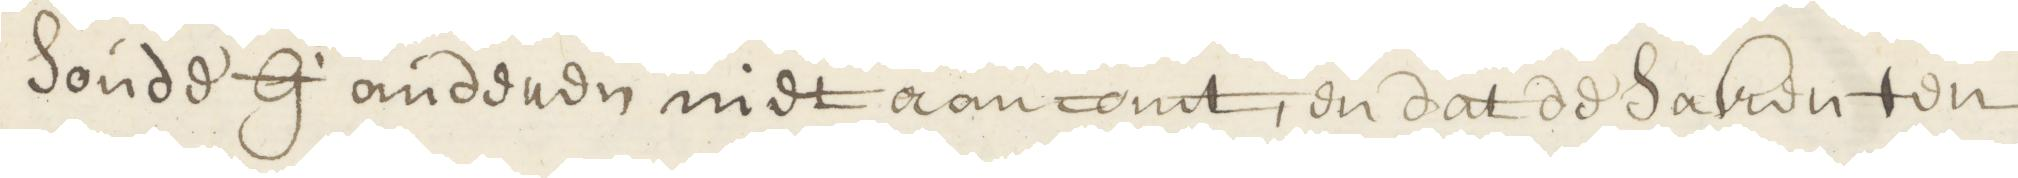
soude g' anderen niet aancomt, en dat de saken ten
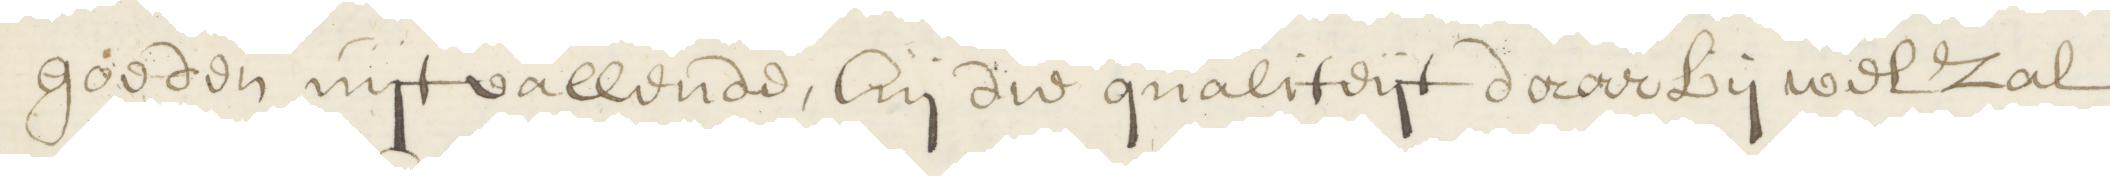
goeden uijtvallende, hij die qualiteijt daar bij wel zal
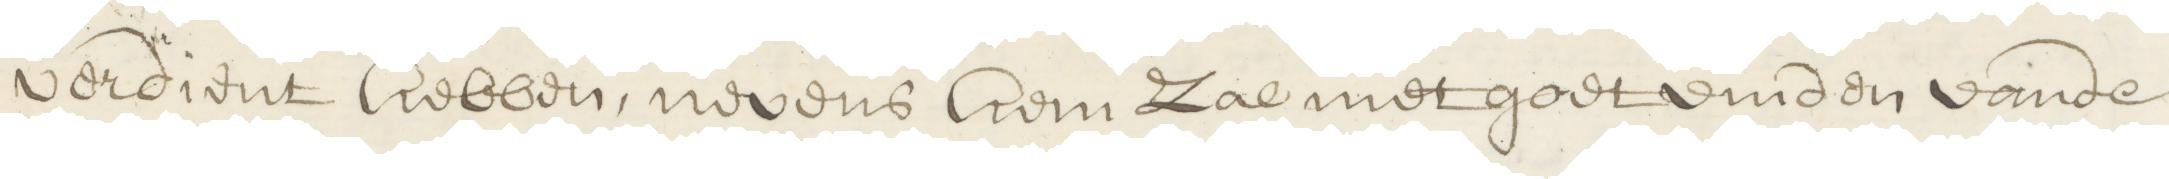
verdient hebben, nevens hem zal met goet vinden vande
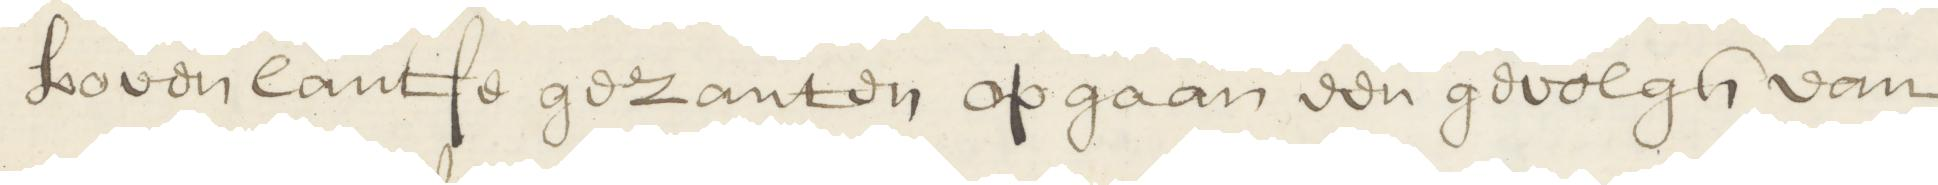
bovenlantse gezanten op gaan een gevolgh van
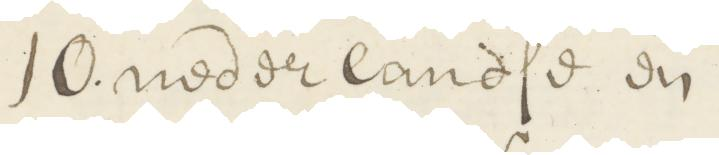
10. nederlandse en
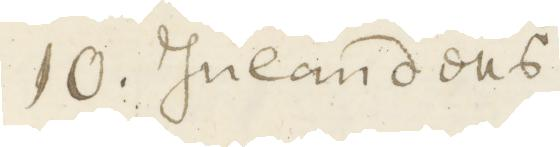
10. Jnlanders
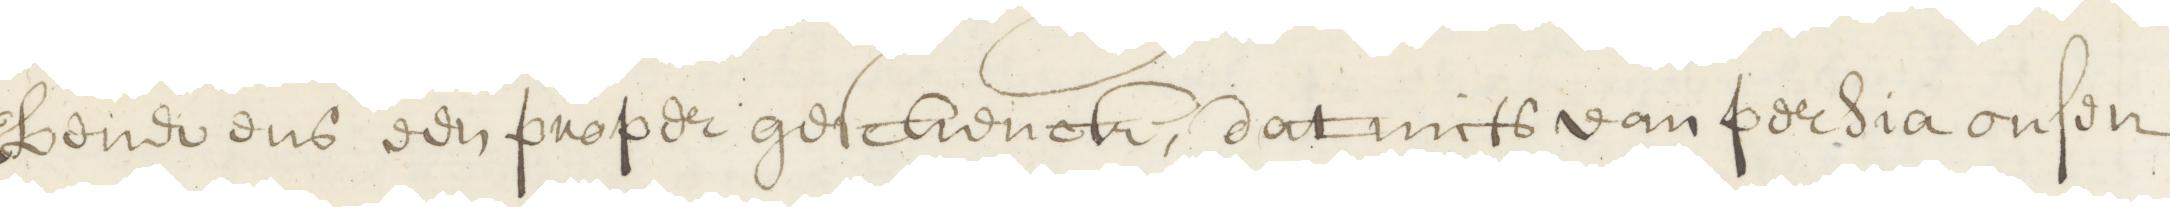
Benevens een proper geschenck, dat mits van persia onsen
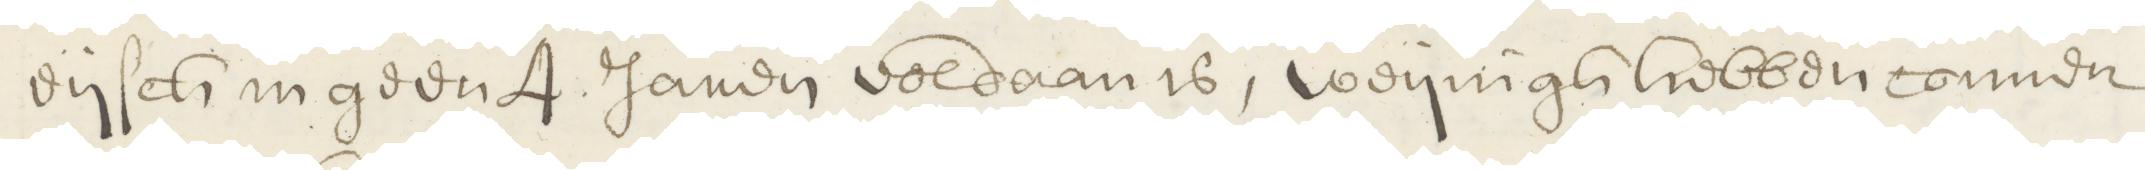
eijsch in geen 4. Jaren voldaan is, weijnigh hebben connen
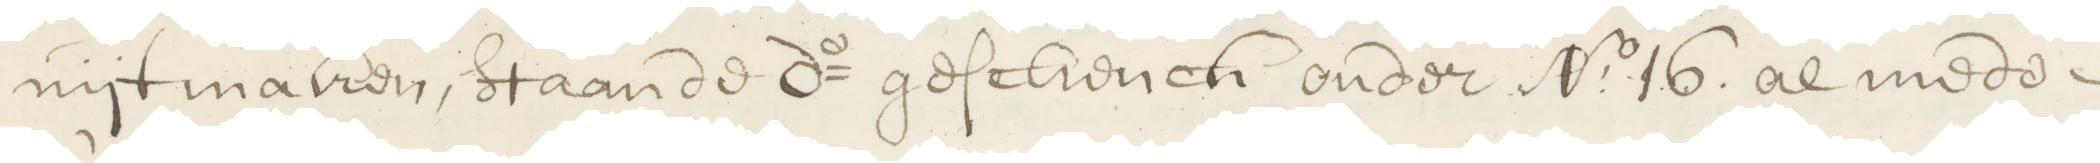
uijt maken, staan de d=o geschenck onder N:o 16. al mede
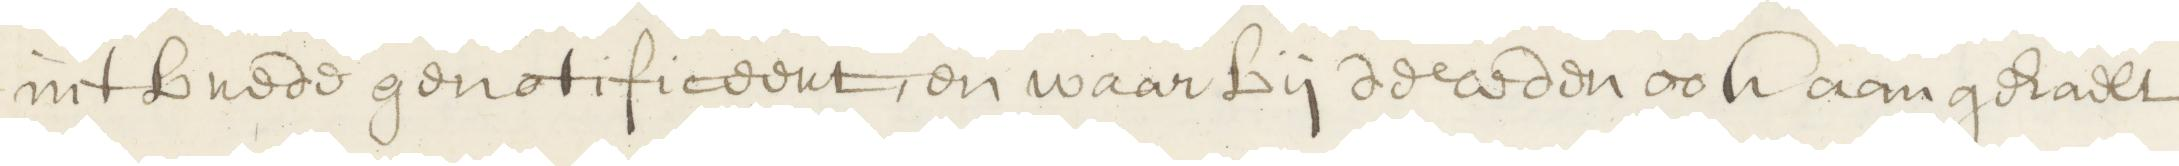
in't brede genotificeert, en waar bij dereden ook aangehaelt
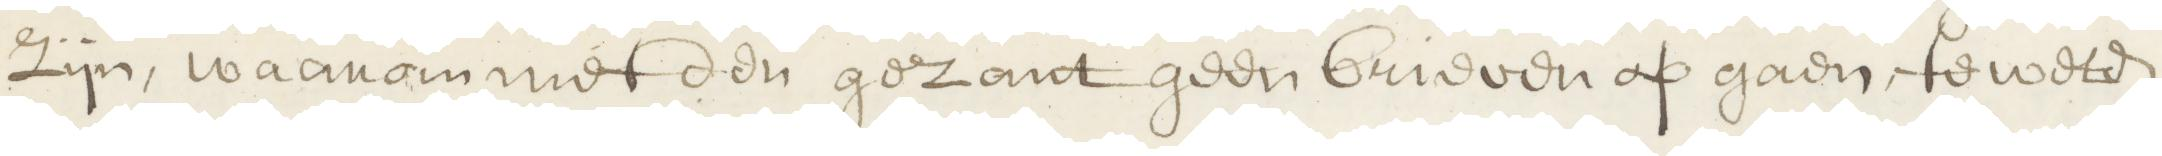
zijn, waarom met den gezant geen brieven op gaen, te weten
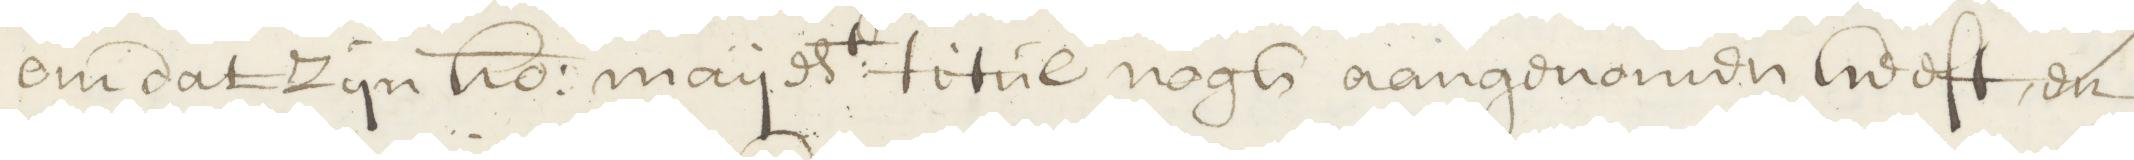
om dat zijn Ho: maijes:t titul nogh aangenomen heeft, en
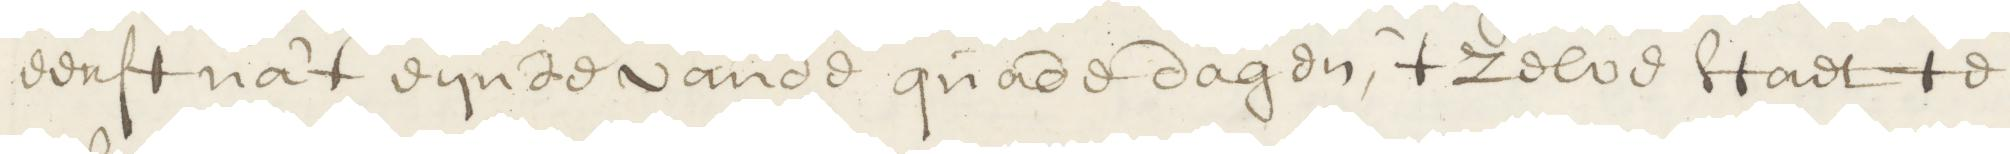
eerst na ’t eijnde van de quade dagen, ’t zelve staet te
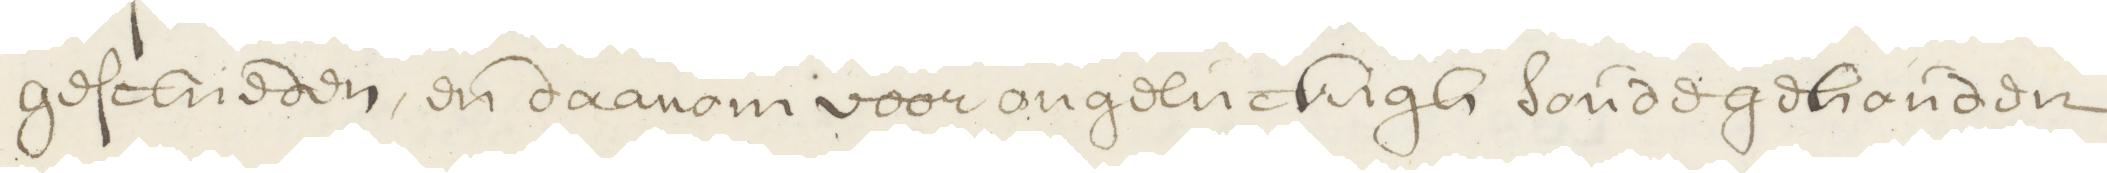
geschieden, en daarom voor ongeluckigh soude gehouden
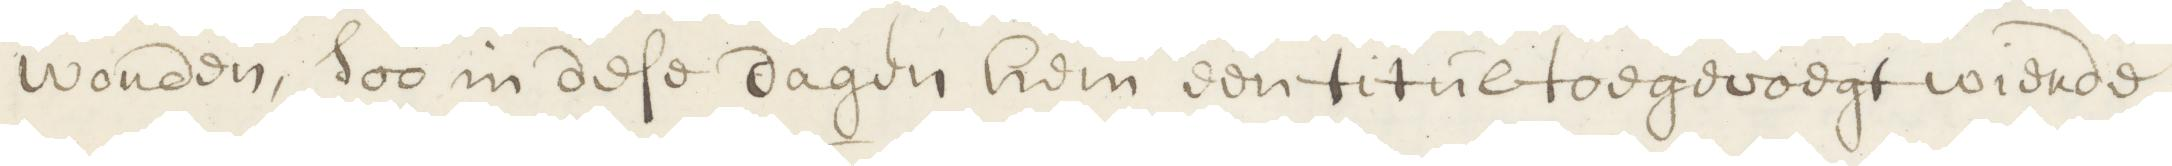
worden, soo in dese dagen hem een titul toegevoegt wierde
